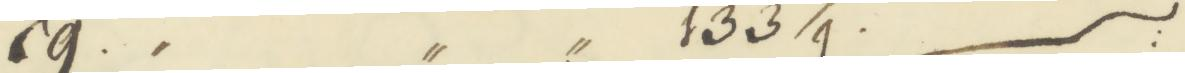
59. „ „ „ 133¾. _:o
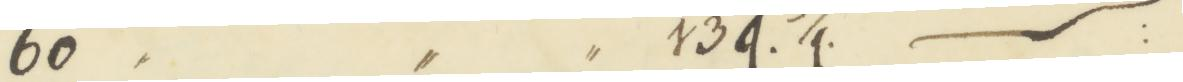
60 „ „ „ 134.¾. _:o
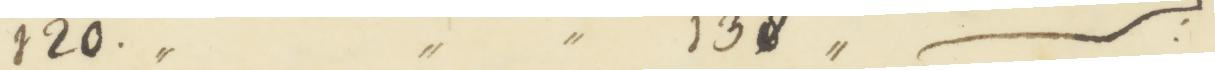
120. „ „ „ 138 „ _:o
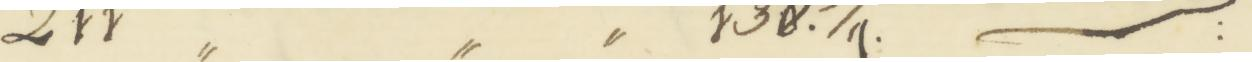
211 „ „ „ 138.¾. _:o
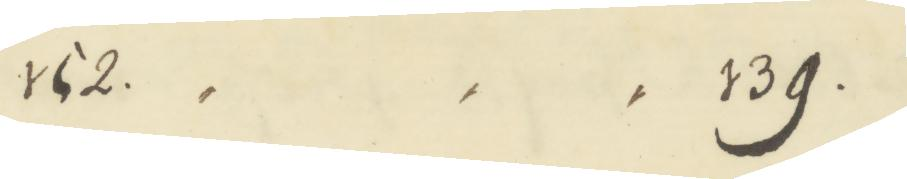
152. „ „ „ 139. _:o
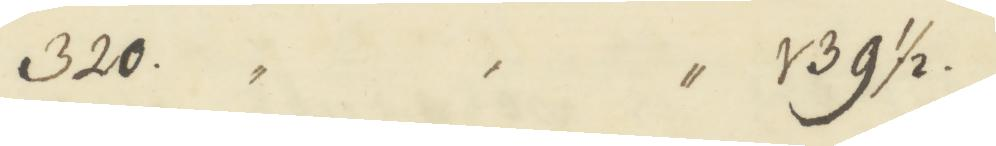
320. „ „ „ 139½. _:o
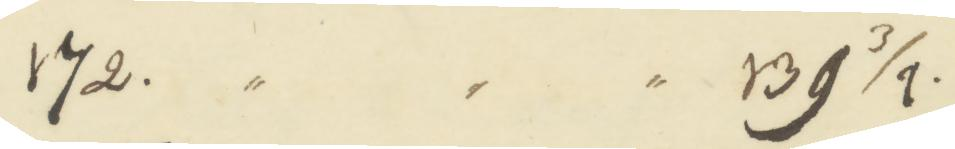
172. „ „ „ 139¼. _:o
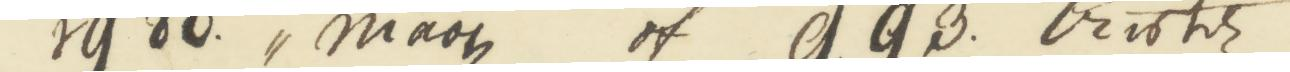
1986. „ maon of 993 kisten
